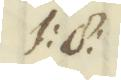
1:8:
